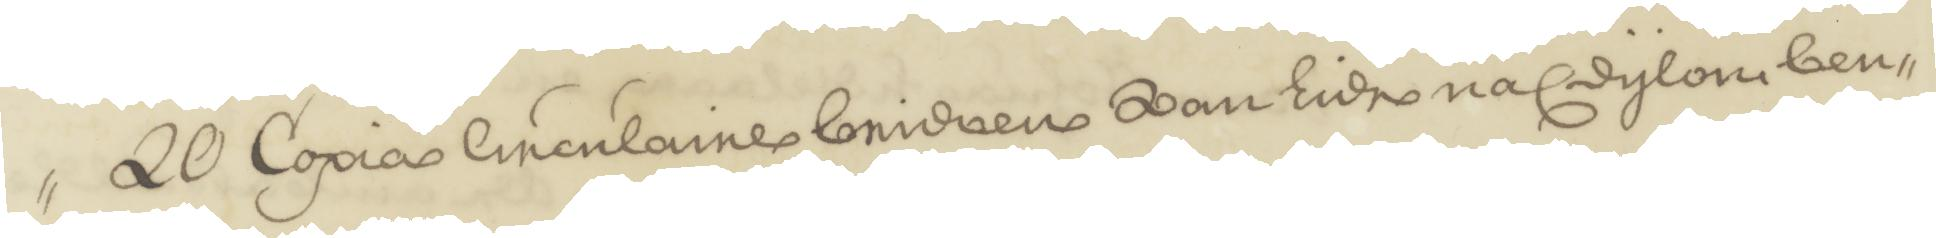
„ 20 Copia Circulaire brieven van hier na Ceijlon ben„
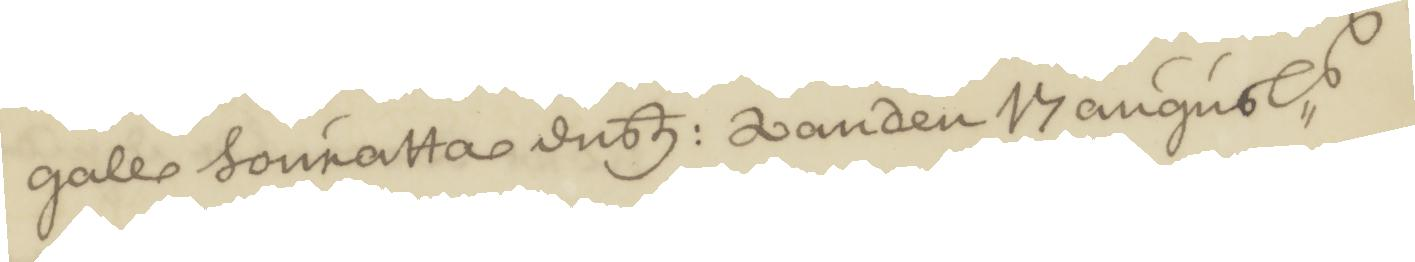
gale souratta ensz: vanden 17 august„s
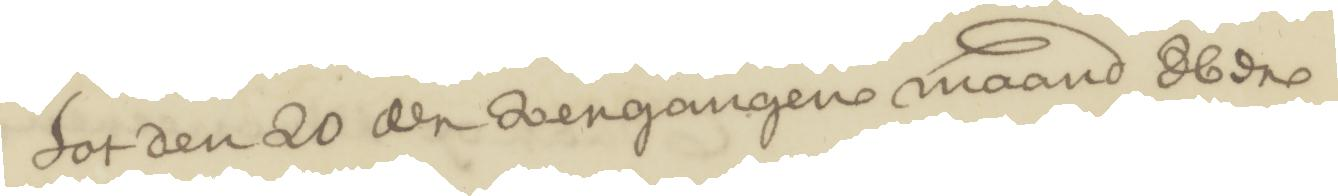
tot den 20 der vergangen maand 8ber
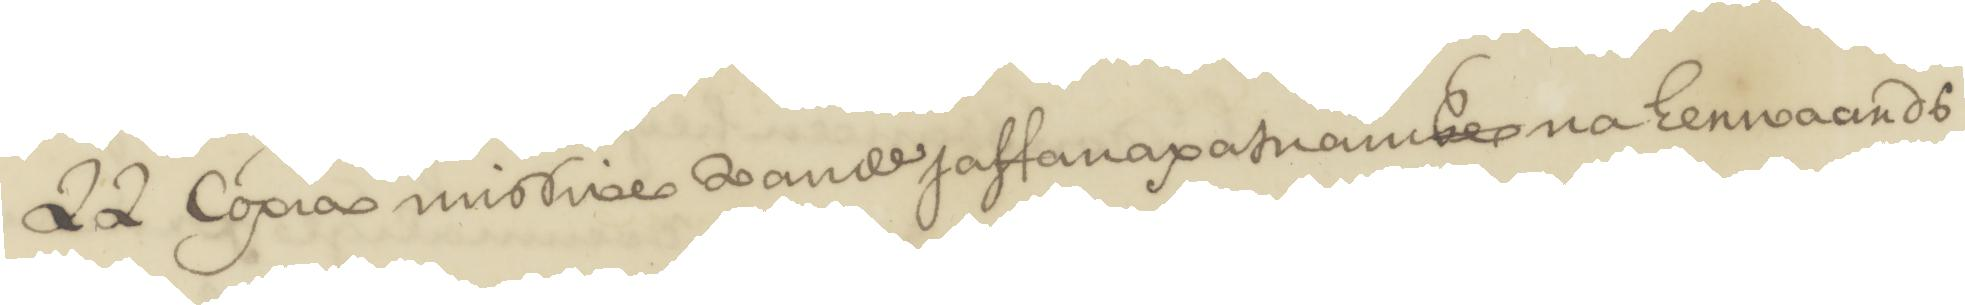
22 Copia missive vande jaffanapatnamse na herwaards
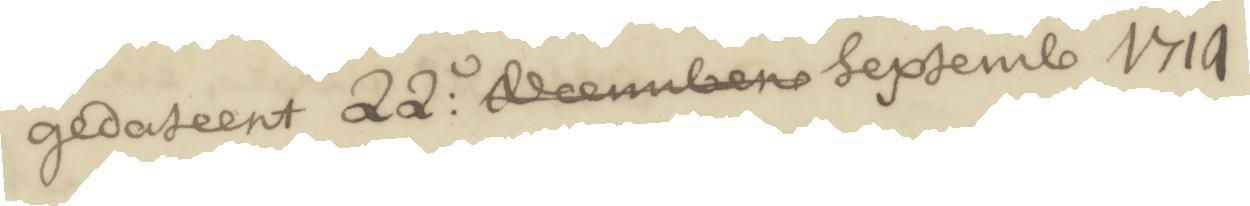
gedateert 22:e december septemb 1714
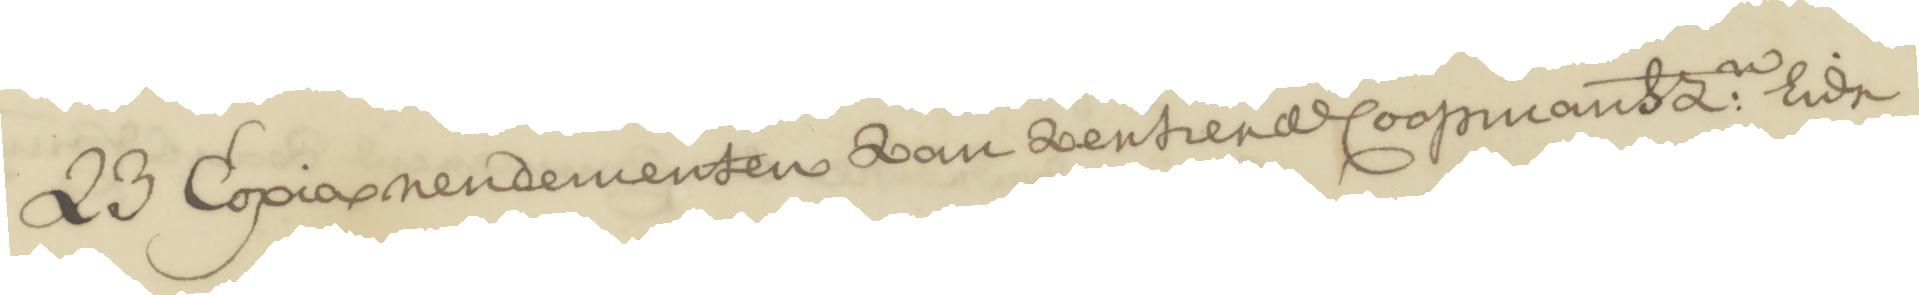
23 Copia rendementen van vertierde Coopmansz:n hier
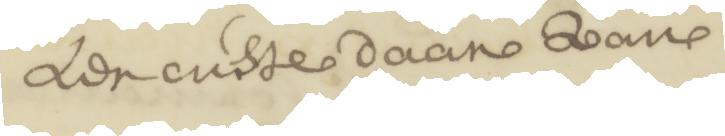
ter custe daar van
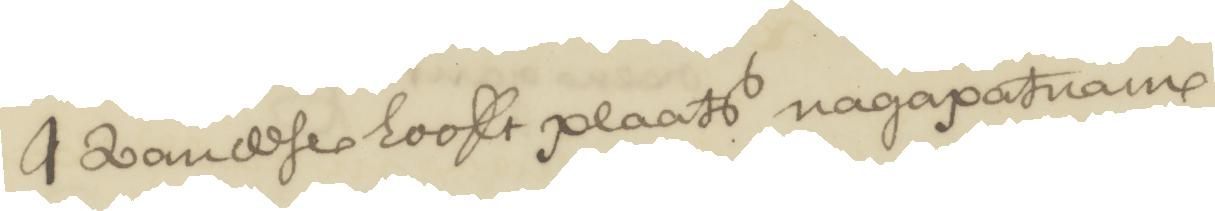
4 van dese hooft plaats nagapatnam
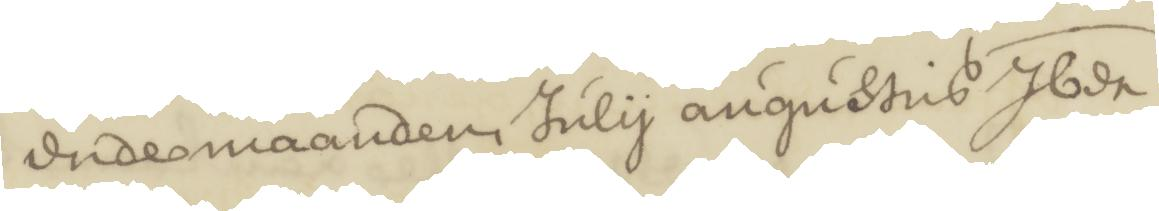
ende maanden Iulij augustus 7ber
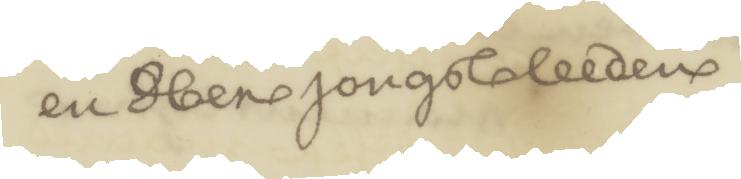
en 8ber jongstleeden
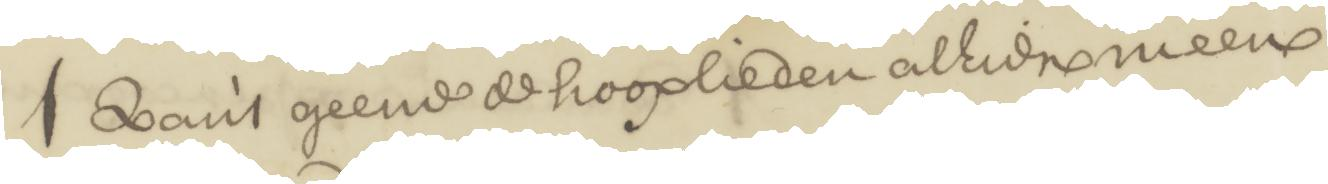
1 van't geene de kooplieden alhier meer
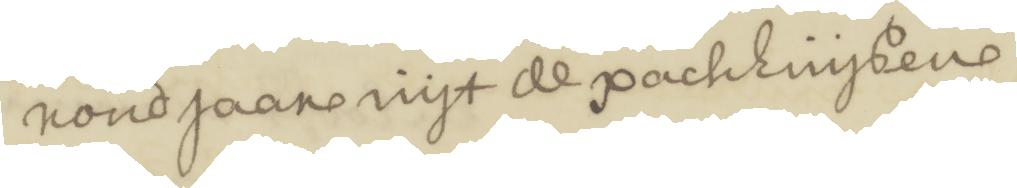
rond jaar uijt de packhuijsen
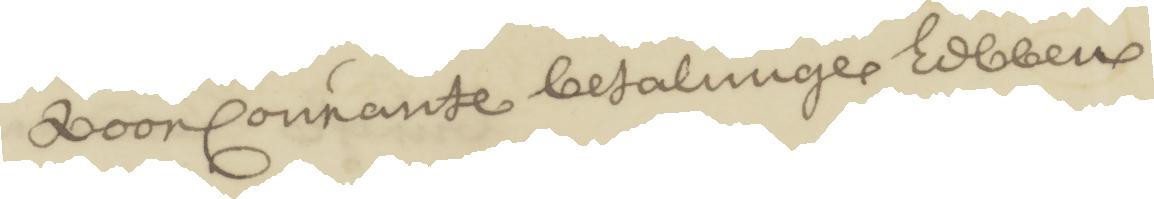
voor courante betalunge hebben
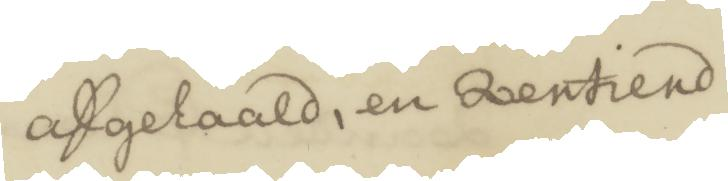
afgehaald, en vertierd
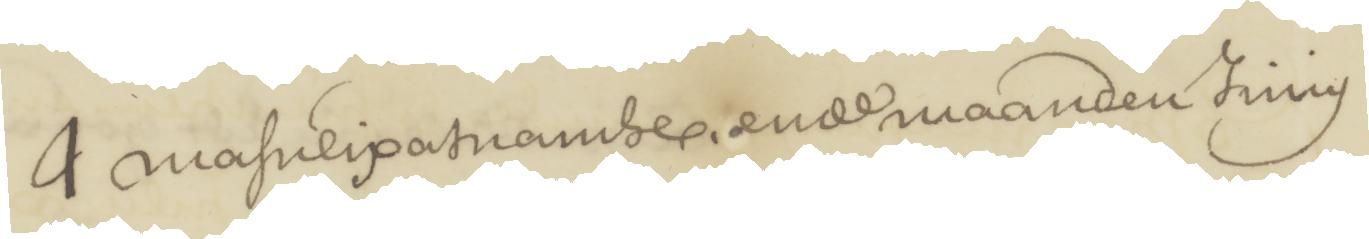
4 masulipatnamse, ende maanden Iunij
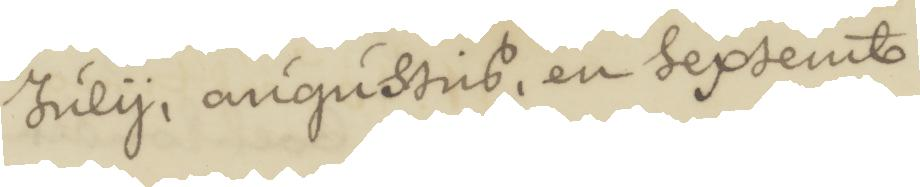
Iulij, augustus, en septemb
